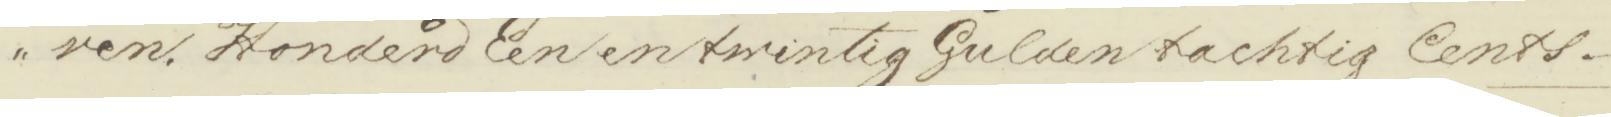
„ven Honderd Een en twintig Gulden tachtig Cents.
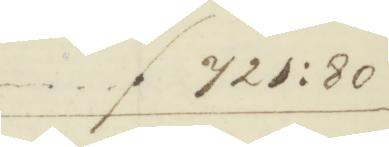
. . . . ƒ 721:80
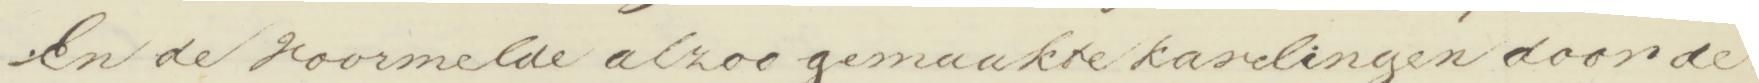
En de voormelde alzoo gemaakte kavelingen door de
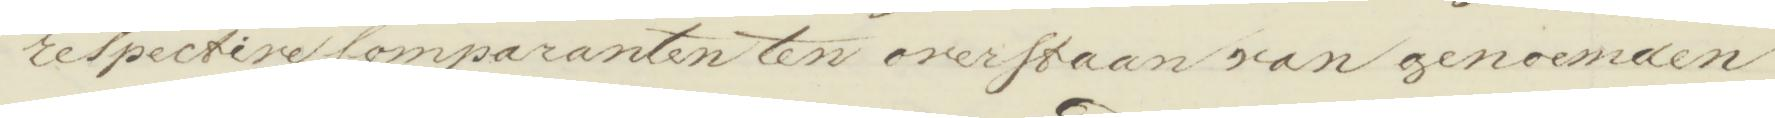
respective Comparanten ten overstaan van genoemden
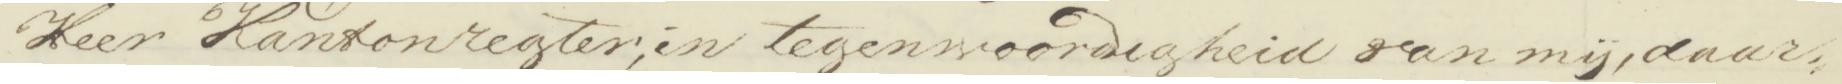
Heer Kantonregter, in tegenwoordigheid van mij, daar„
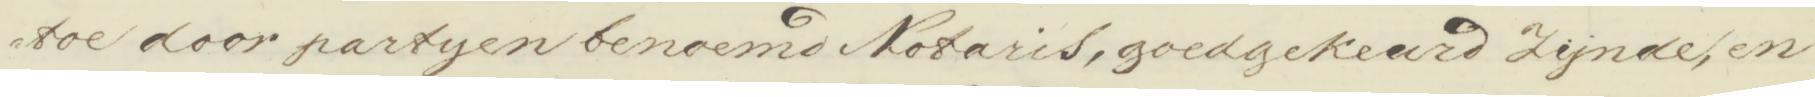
„toe door partyen benoemd Notaris, goedgekeurd zijnde, en
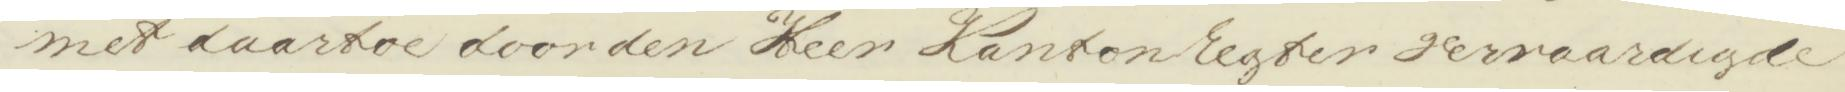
met daartoe door den Heer Kanton Regter vervaardigde
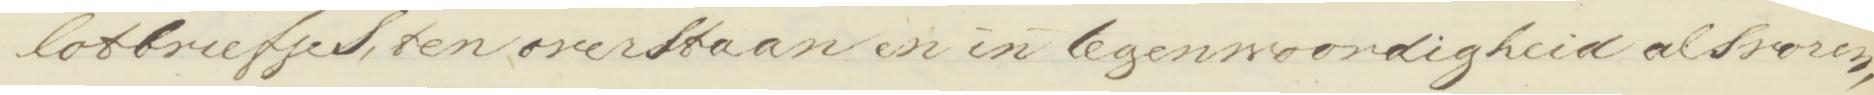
lotbriefjes, ten overstaan en in tegenwoordigheid als voren
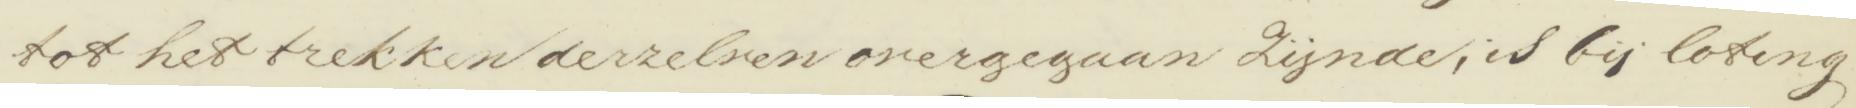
tot het trekken derzelven overgegaan zijnde, is bij loting
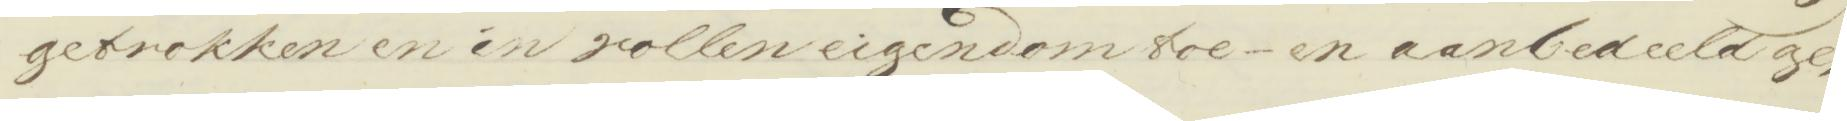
getrokken en in vollen eigendom toe- en aanbedeeld ge,
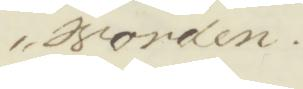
„worden
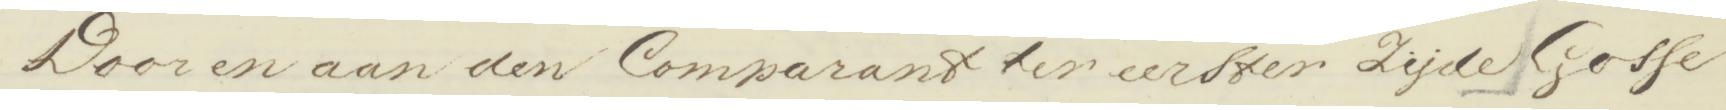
Door en aan den Comparant ter eerster zijde Gosse
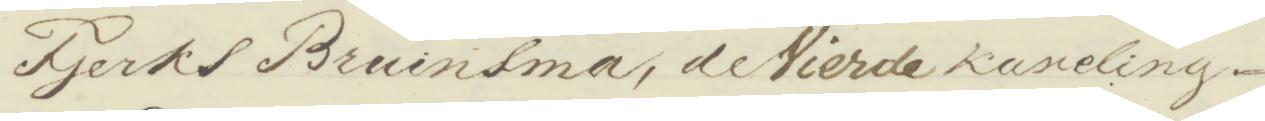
Tjerks Bruinsma, de Vierde kaveling-
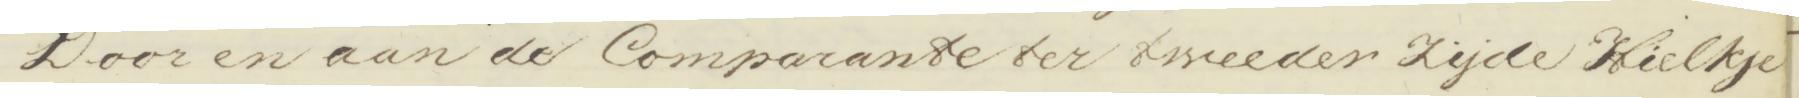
Door en aan de Comparante ter tweeder zijde Hielkje
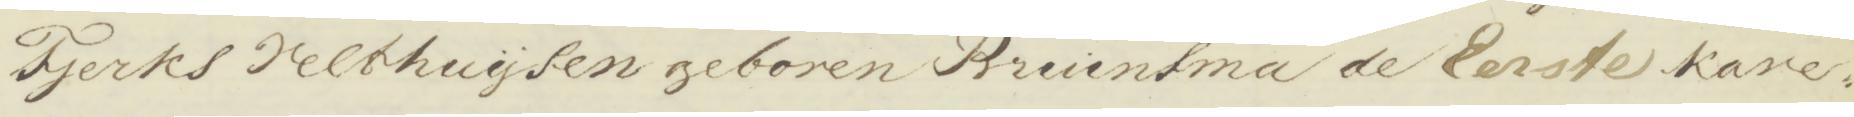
Tjerks Velthuijsen geboren Bruinsma de Eerste kave„
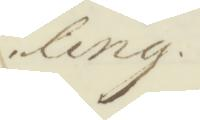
„ling.
